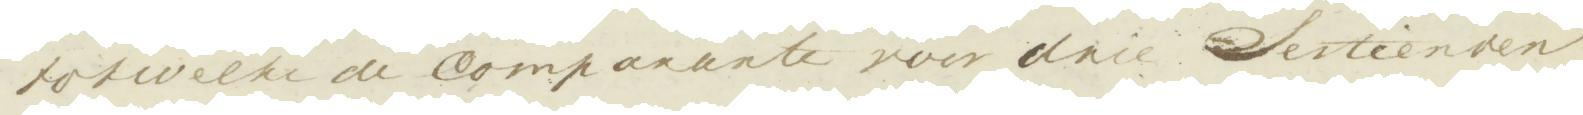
tot welke de Comparante voor drie sestienden
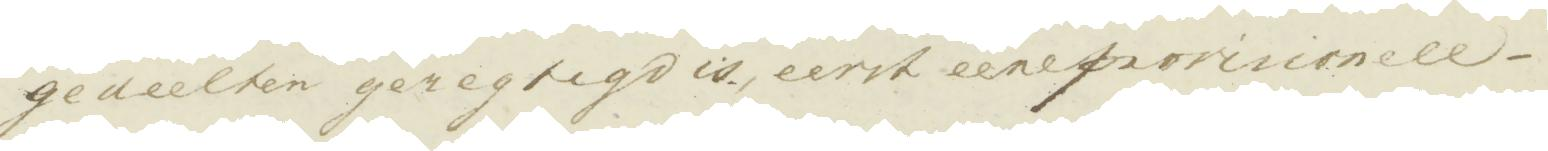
gedeelten geregtigd is, eerst eene provisionele -
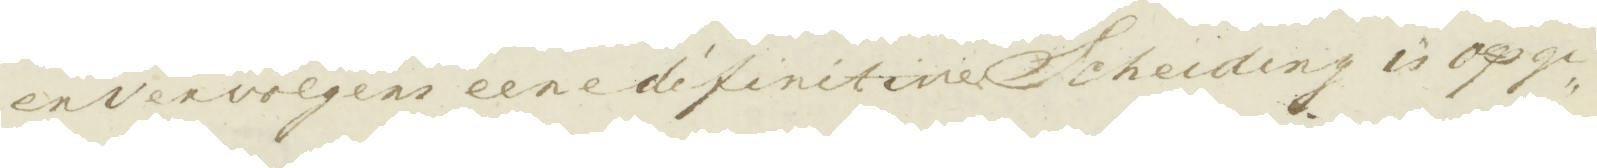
en vervolgens eene définitive scheiding is opge„
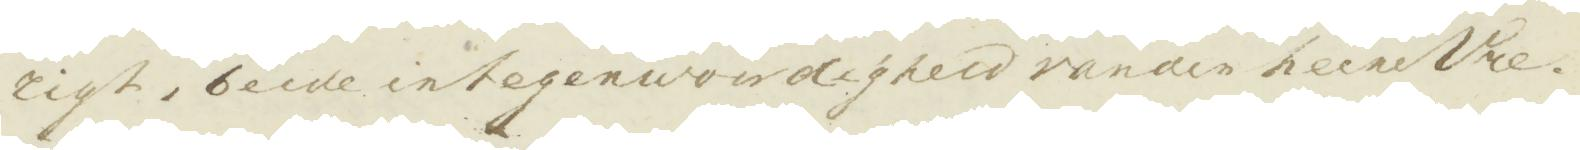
rigt, beide in tegenwoordigheid van den heere Vre-
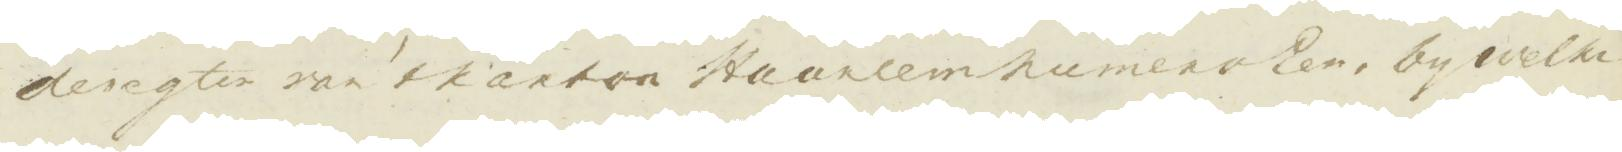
deregter van ’t kanton Haarlem numero Een, by welke
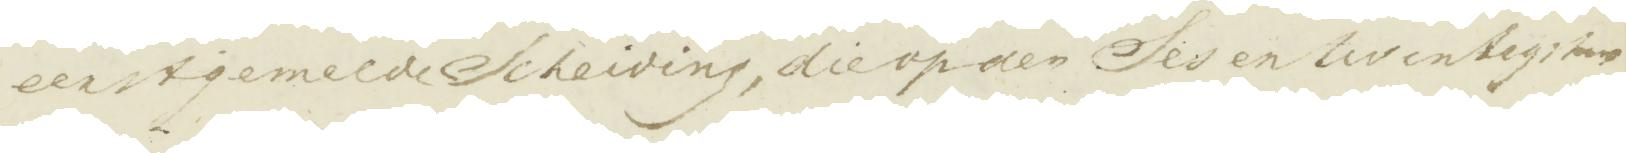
eerstgemelde scheiding, die op den ses en twintigsten
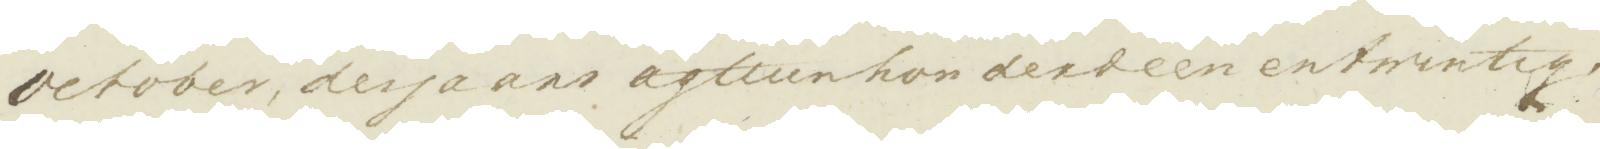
October, des jaars agttien honderd een en twintig
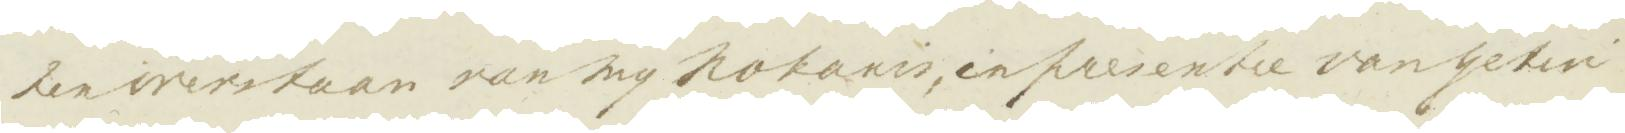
ten overstaan van my Notaris, in presentie van getui
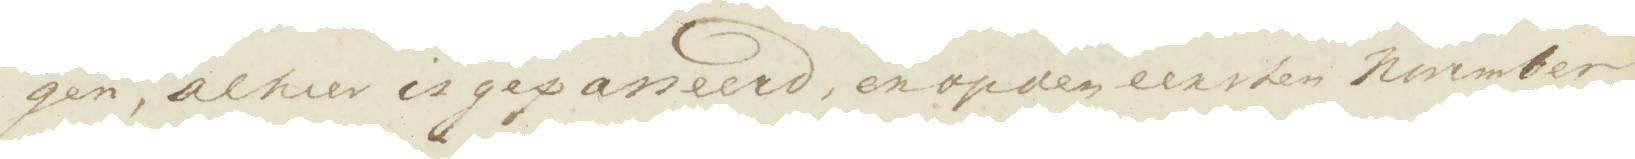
gen, alhier is gepasseerd, en op den eersten November
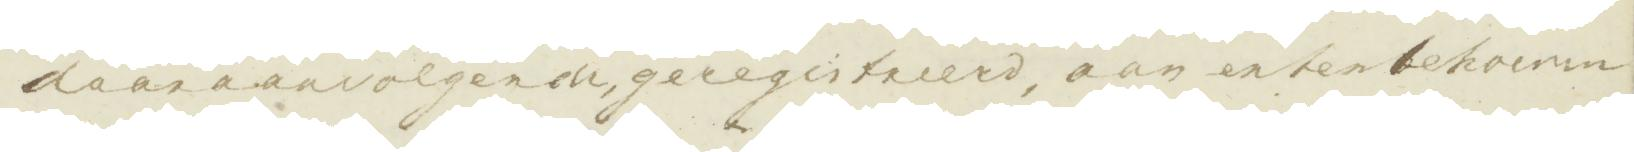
daar aan volgende, geregistreerd, aan en ten behoeven
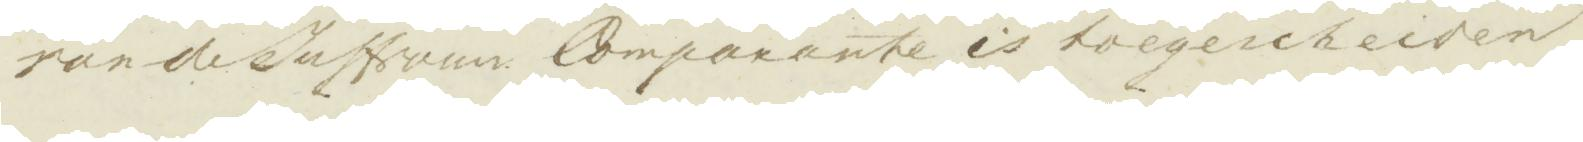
van de Iuffrouw Comparante is toegescheiden
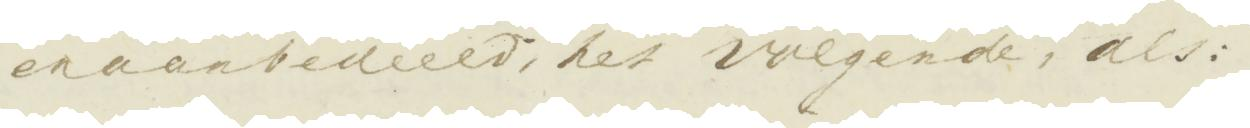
en aanbedeeld, het volgende, als:
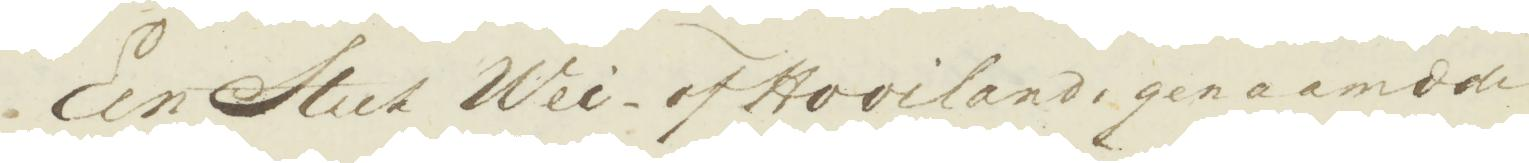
Een Stuk Wei-of Hooiland, genaamd de
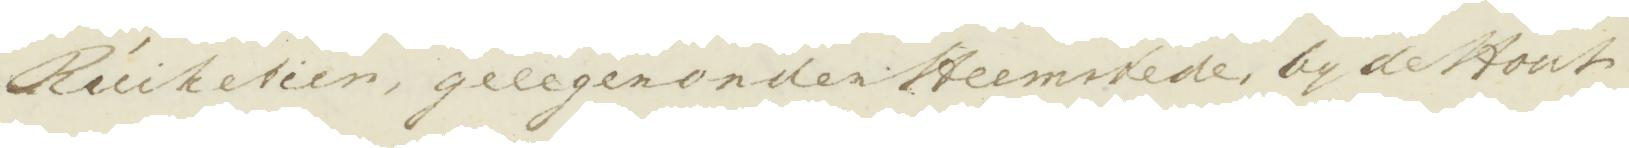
Ruiketier, gelegen onder Heemstede, by de Hout
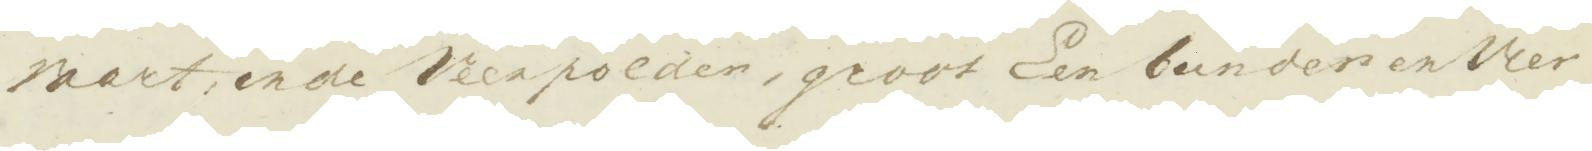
vaart, in de Veerpolder, groot Een bunder en Vier
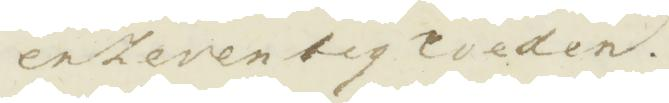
en zeventig roeden.
